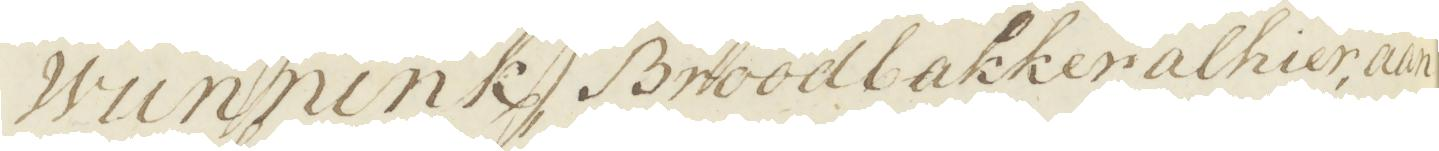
Wunnink, Broodbakker alhier, aan
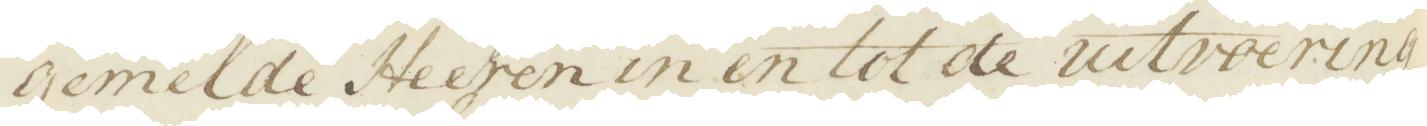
gemelde Heeren in en tot de uitvoering
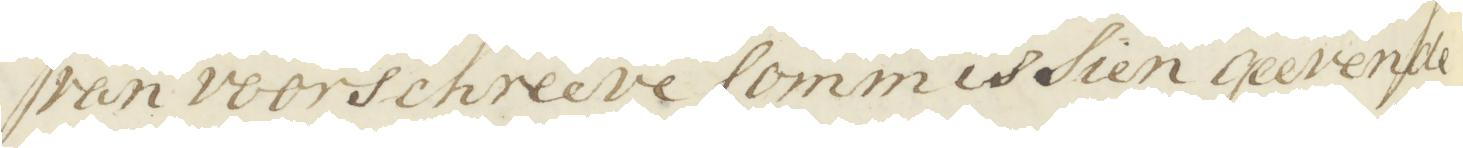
van voorschreeve Commissien geevende
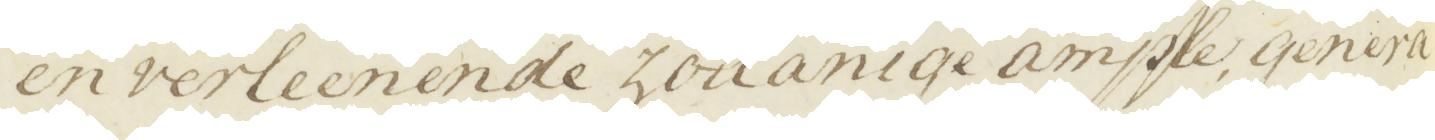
en verleenende zodanige ample, genera
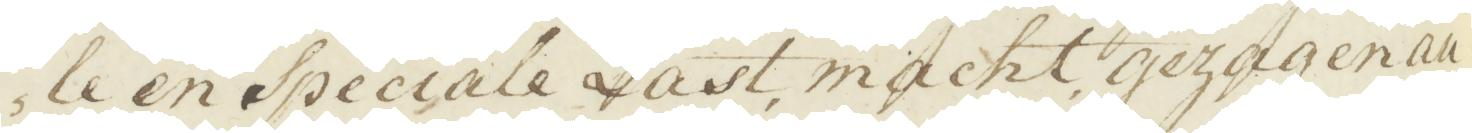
„le en Speciale Last, macht, gezag en au
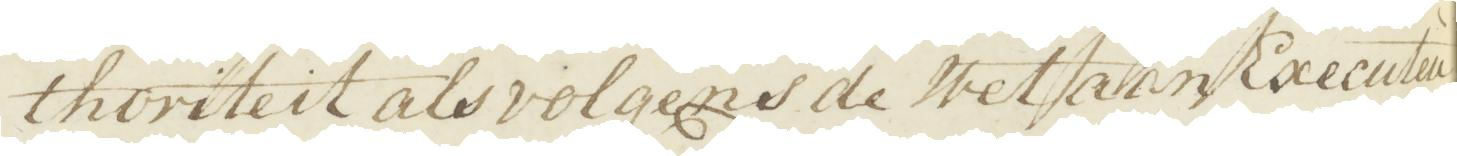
thoriteit als volgens de Wet aan Executeu
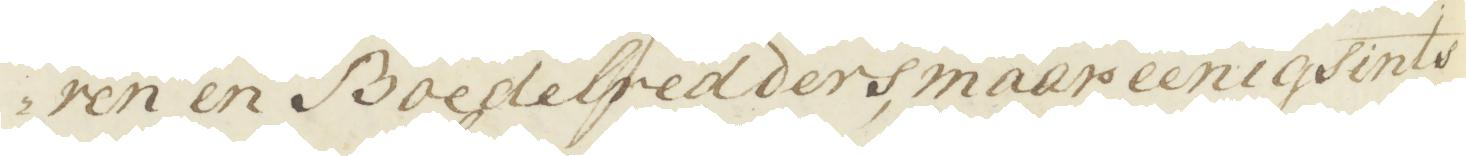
„ren en Boedelredders, maar eenigsints
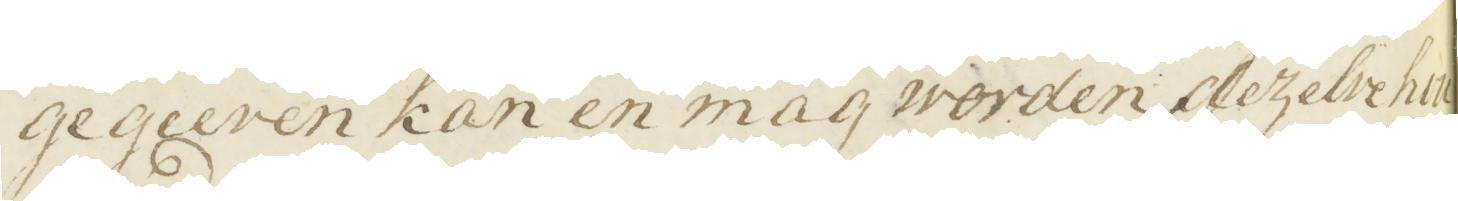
gegeeven kan en mag worden dezelve hou
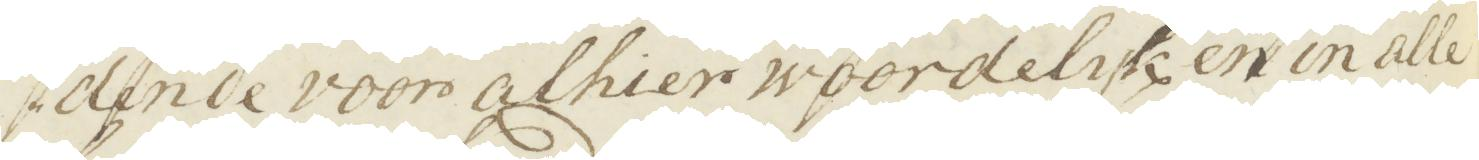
„dende voor alhier woordelyk en in alle
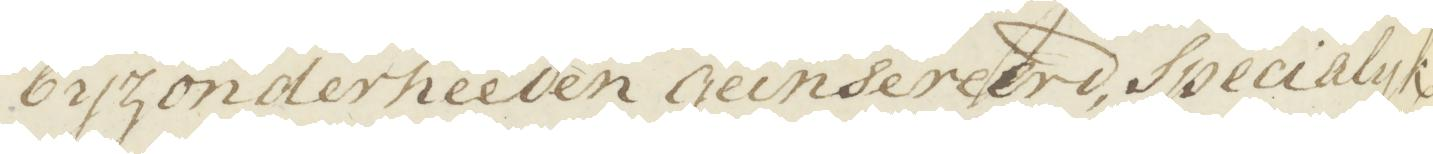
byzonderheeden geinsereerd, specialyk
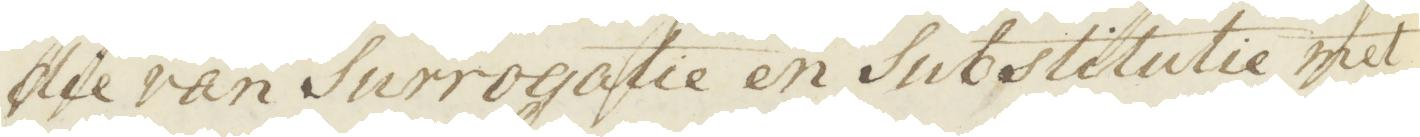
die van Surrogatie en Substitutie, met
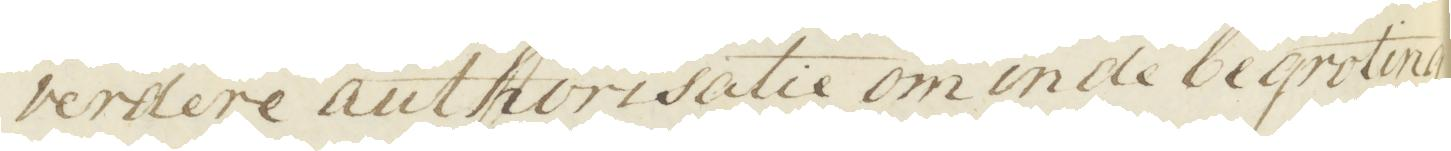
verdere authorisatie om in de begroting
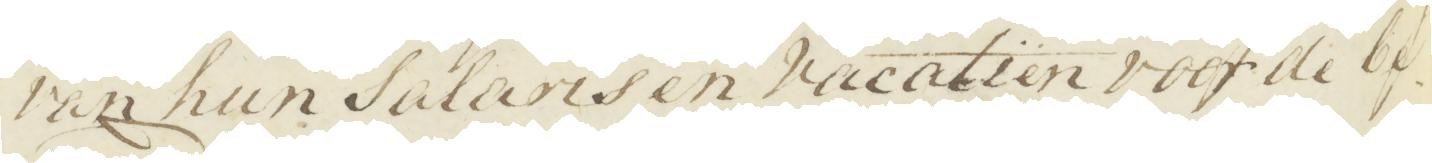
van hun Salaris en Vacatiën voor de be„
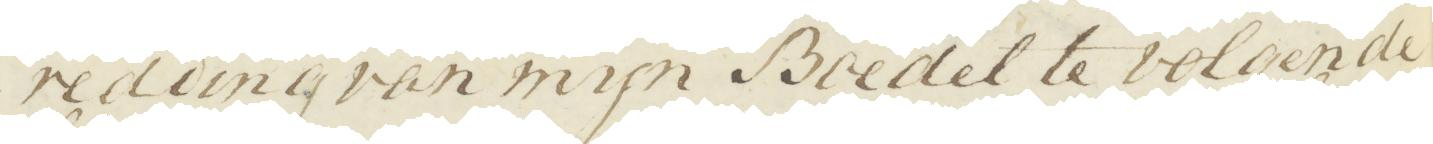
„redding van myn Boedel te volgen de
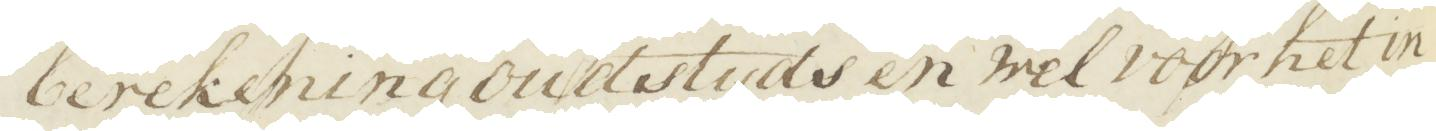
berekening oudstyds en wel voor het in
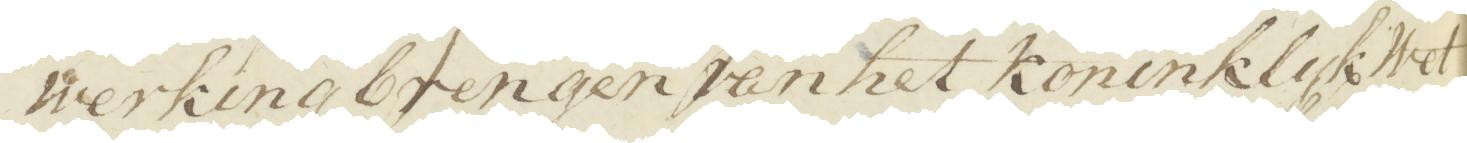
werking brengen van het Koninklyk Wet
